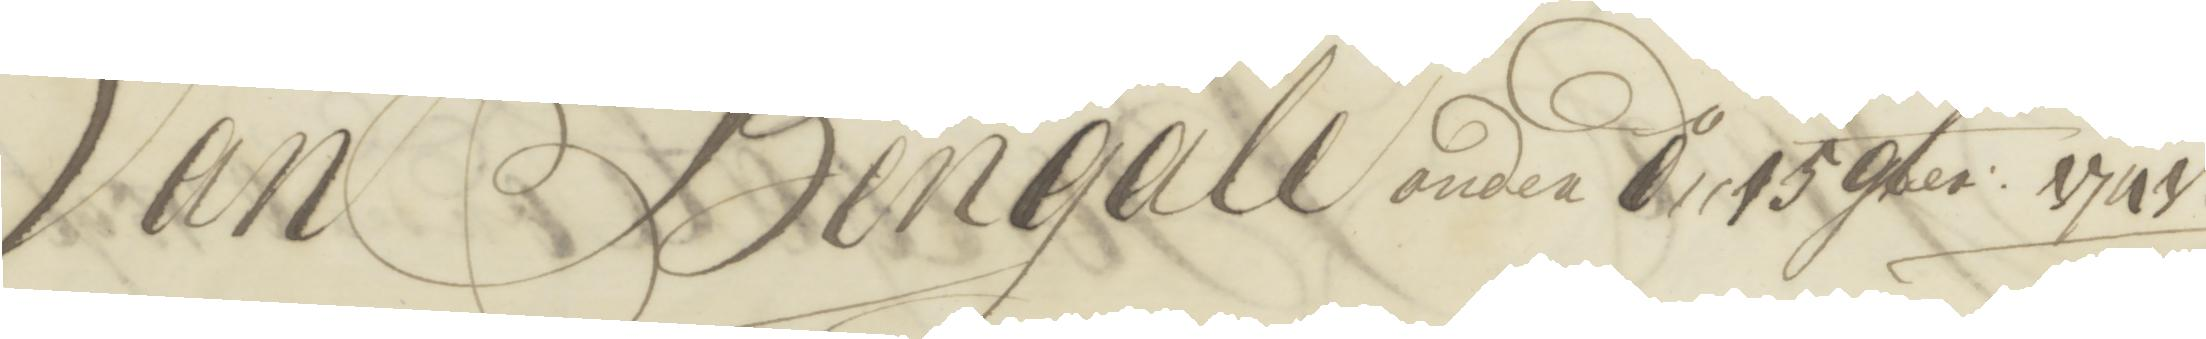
Van Bengale onder d„o 15 9ber: 1741
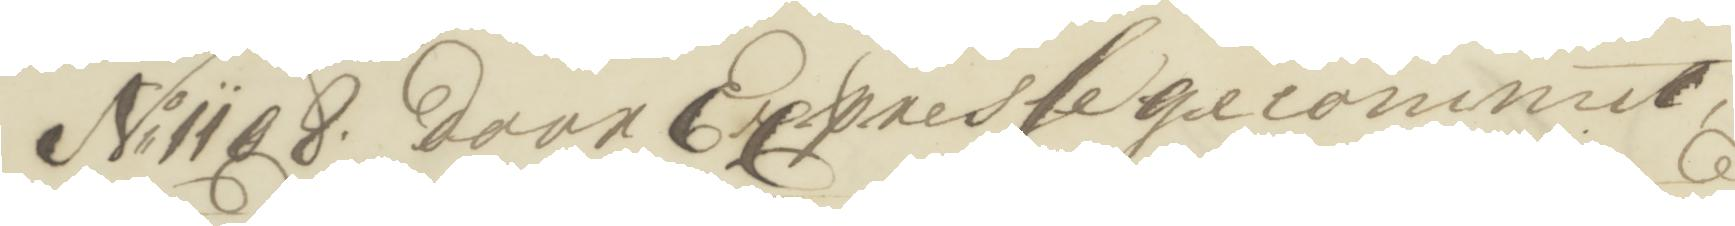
N„o 1108. door Expresse gecommit,
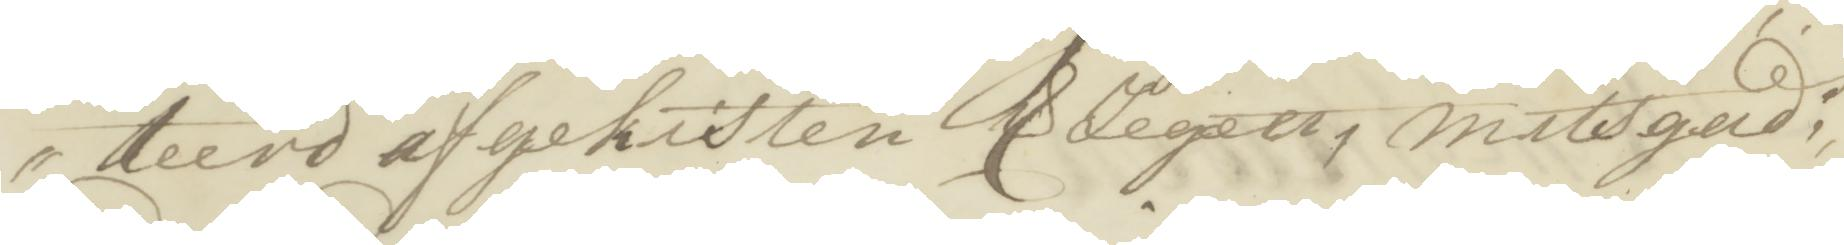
„ teerd afgekisten verzegelt, mitsgad„s
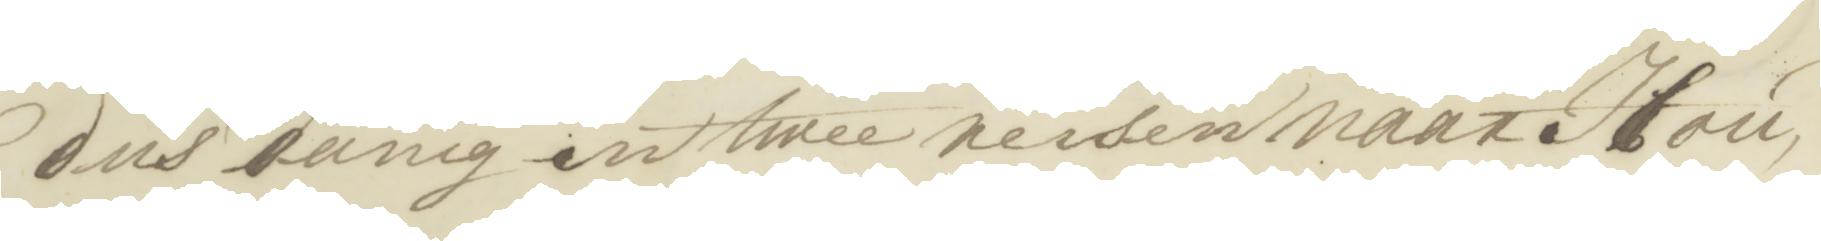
dus danig in twee reisen naar Hou,
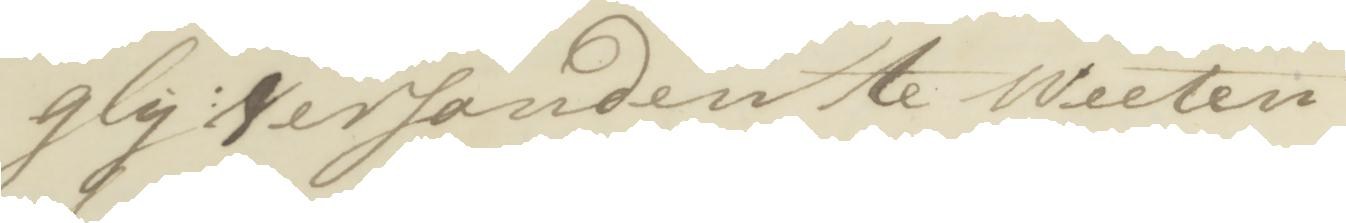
glij: versonden te weeten
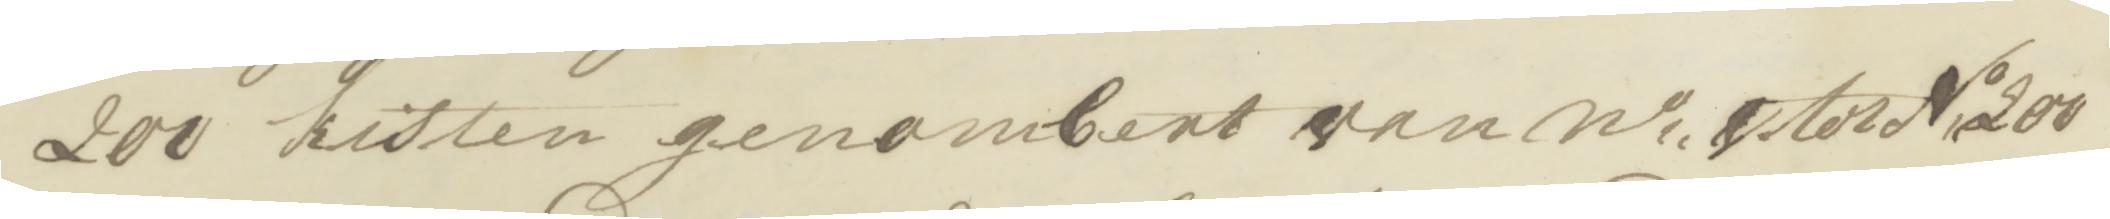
200 kisten genombert van n„o 1 tot N„o 200
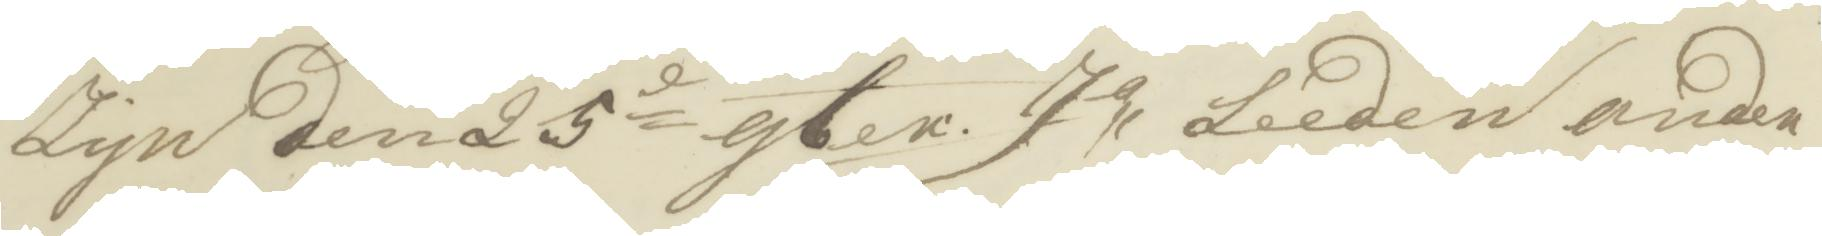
zijn den 25=e 9ber: J„o leeden onder
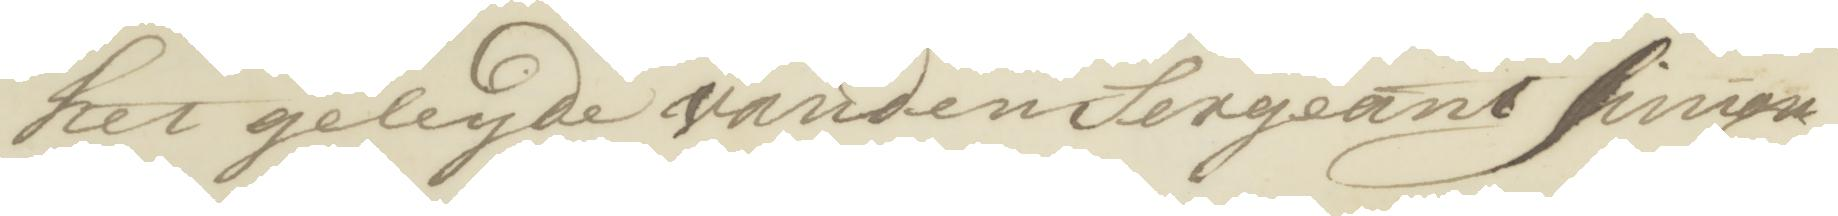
het geleyde vanden sergeant Simon
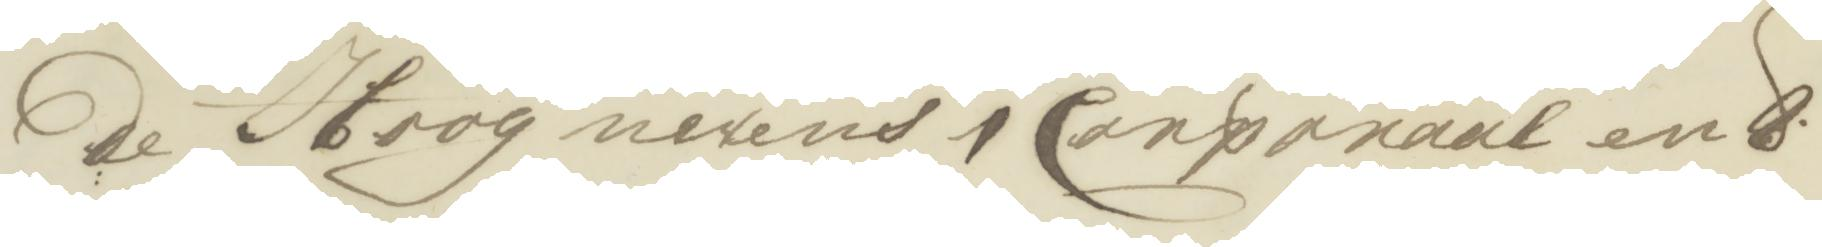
de Hoog nevens 1 Corporaal en 8.
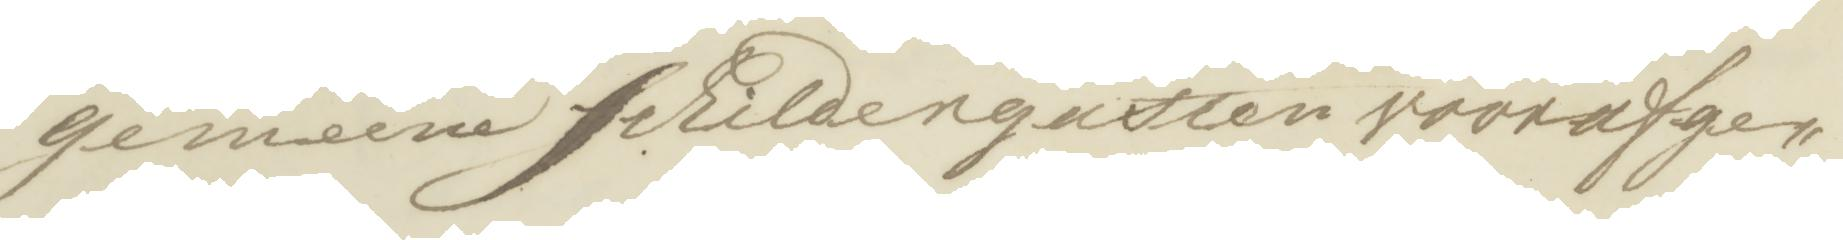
gemeene schildergasten voorafge„
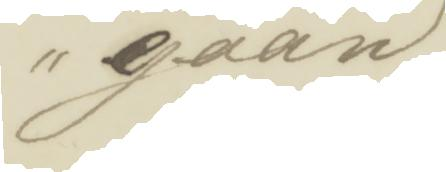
„gaan
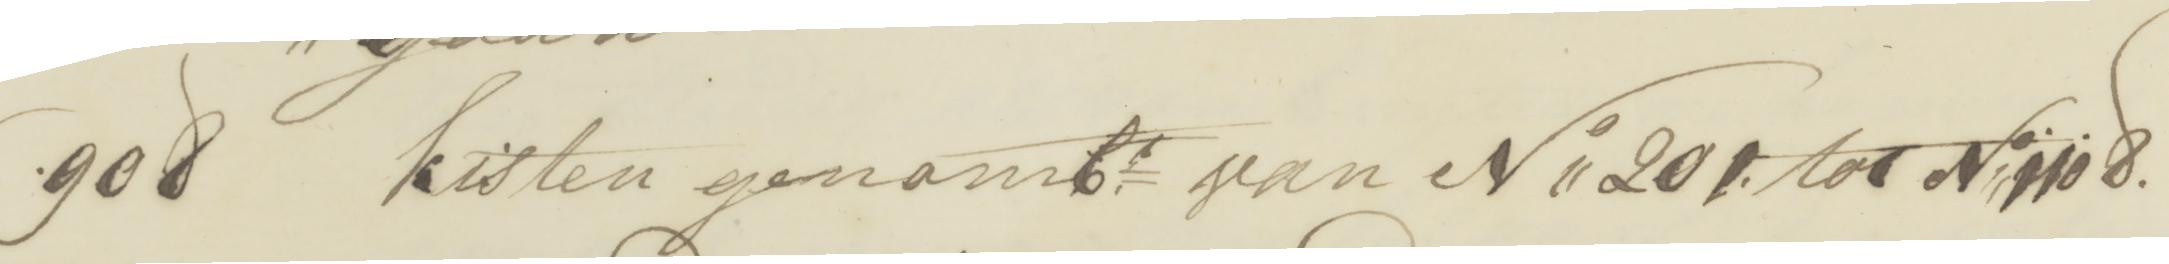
908 kisten genomb.=t van N„o 201. tot N„o 1108.
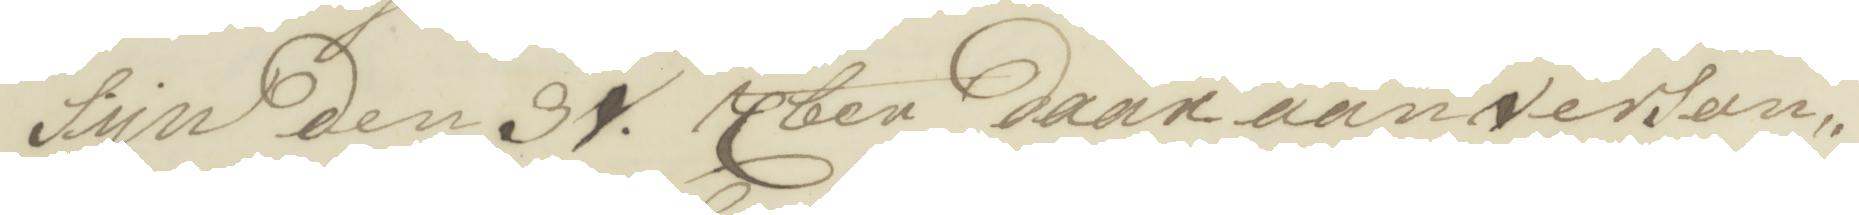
sijn den 31. xber daar aan verson„
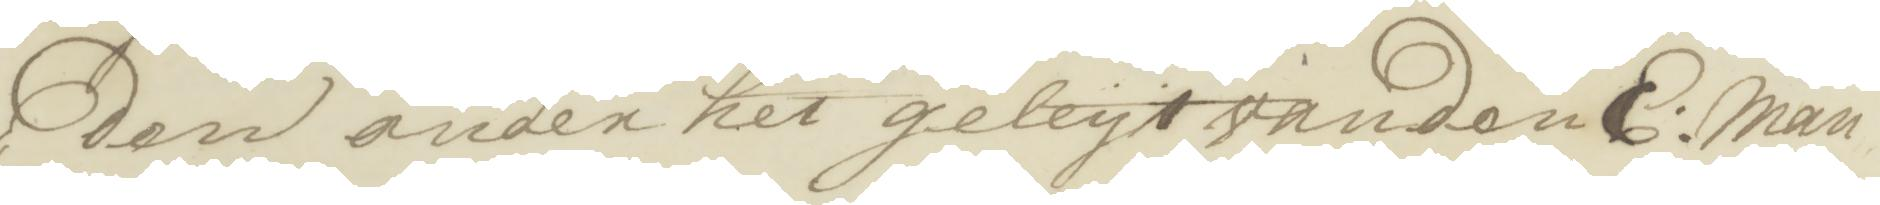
den onder het geleijt van den E: man
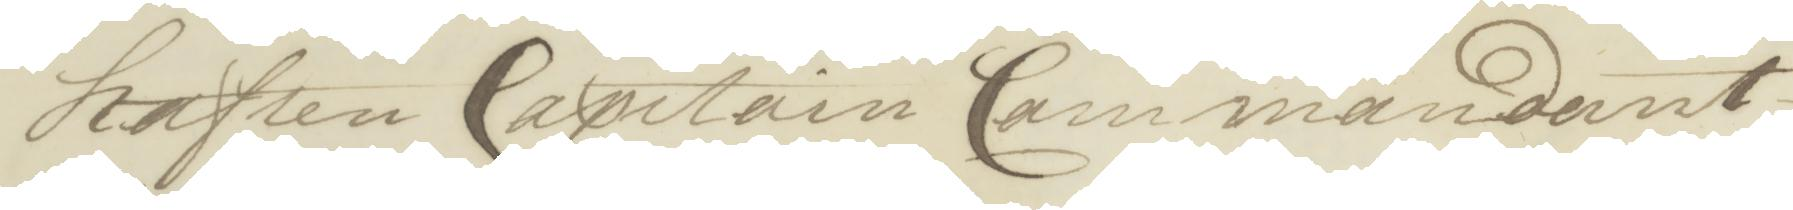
haften Capitain Commandant
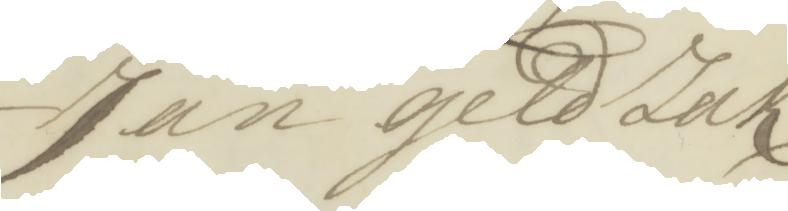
Jan geldzak
